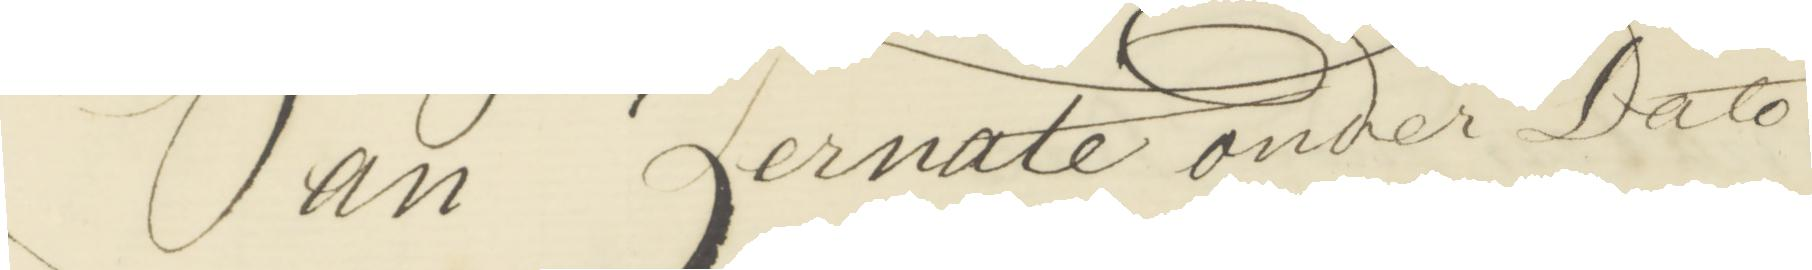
Van Ternate onder Dato
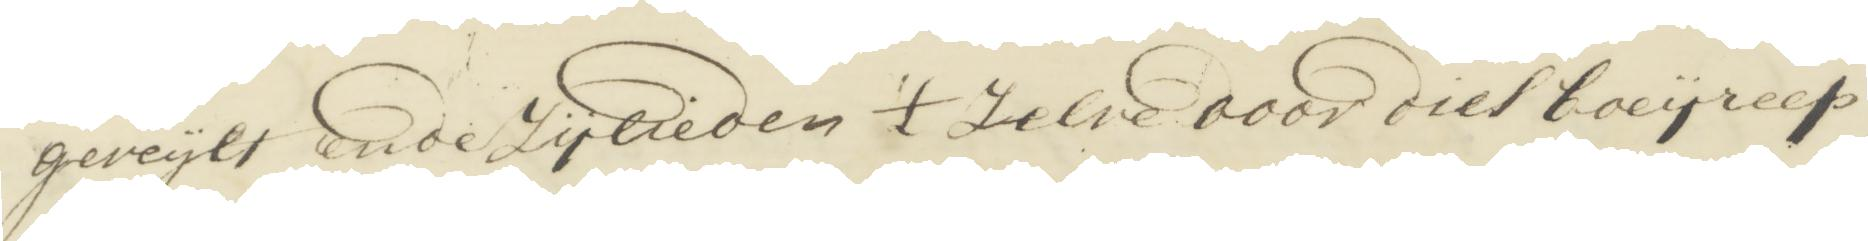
geveijlt ende zijlieden ’t zelve door dies boeijreep
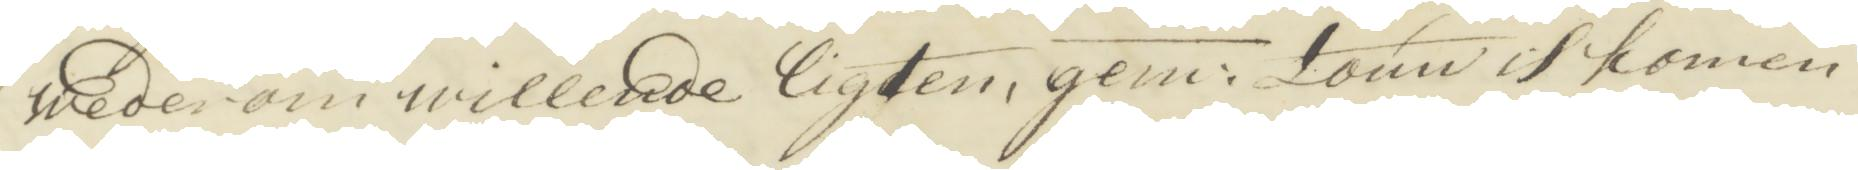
weder om willende ligten, gem: touw is komen
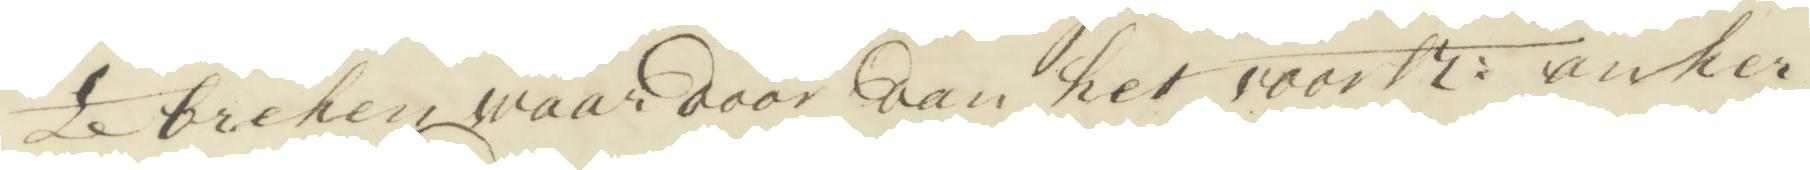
te breken waardoor dan het voorsz: anker
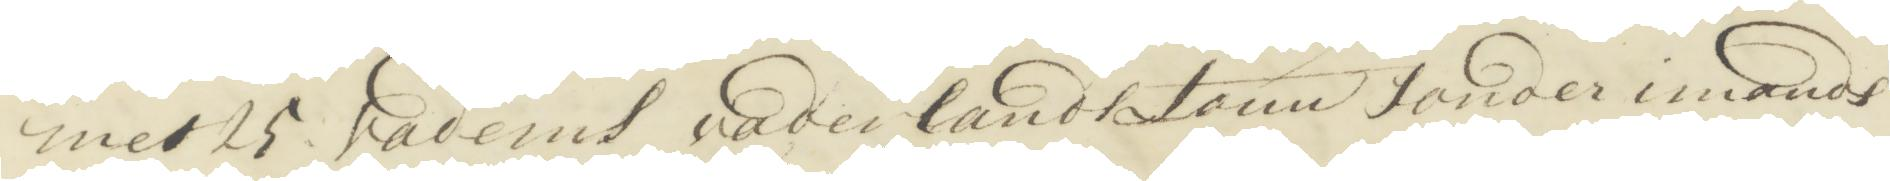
met 25. vadems vaderlands touw sonder imands
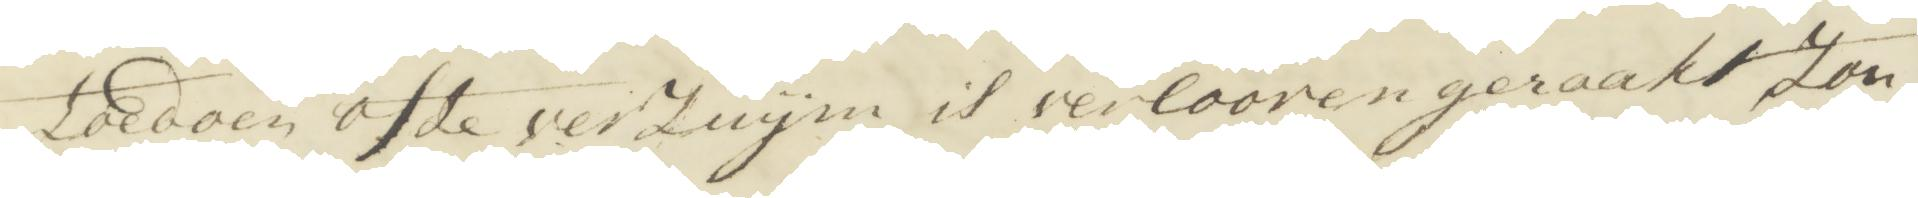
toedoen ofte verzuijm is verlooren geraakt, zon
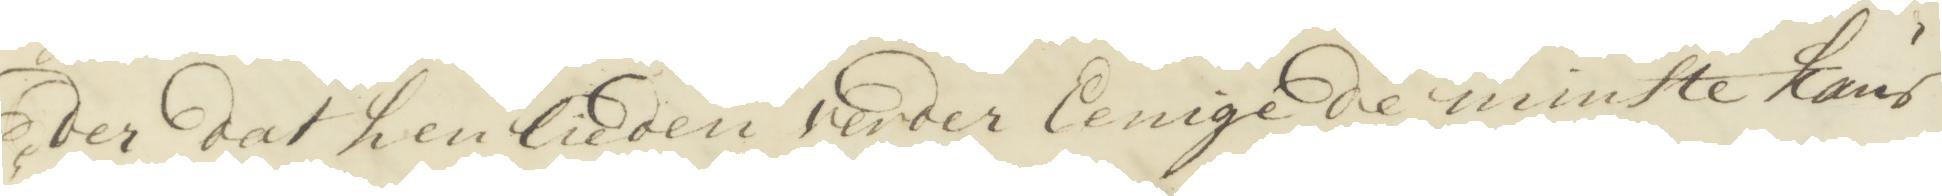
der dat hen lieden verder Eenige de minste kans
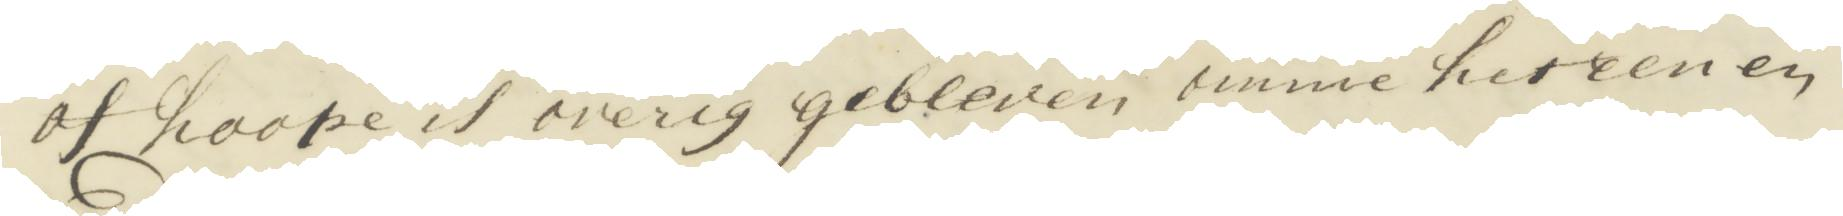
of hoope is overig gebleven omme het een en
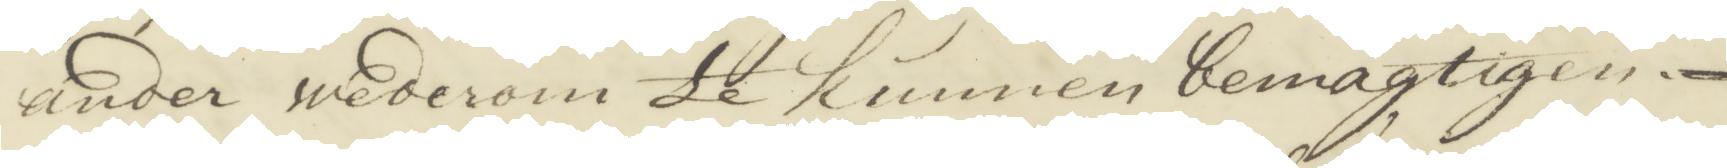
ander wederom te kunnen bemagtigen. —
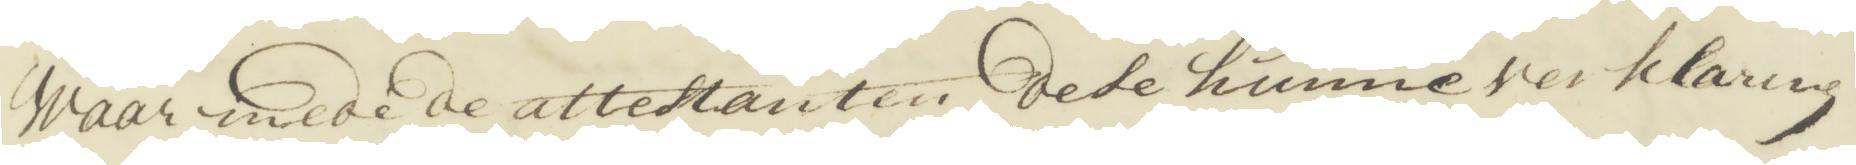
Waar mede de attestanten dese hunne verklaring
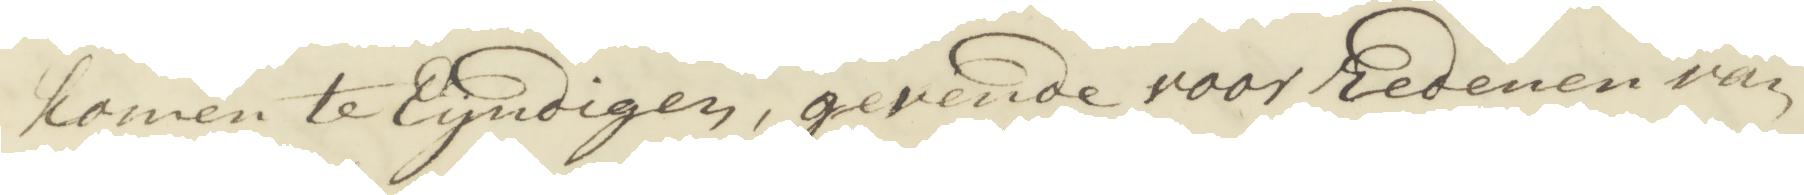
komen te Eijndigen, gevende voor redenen van
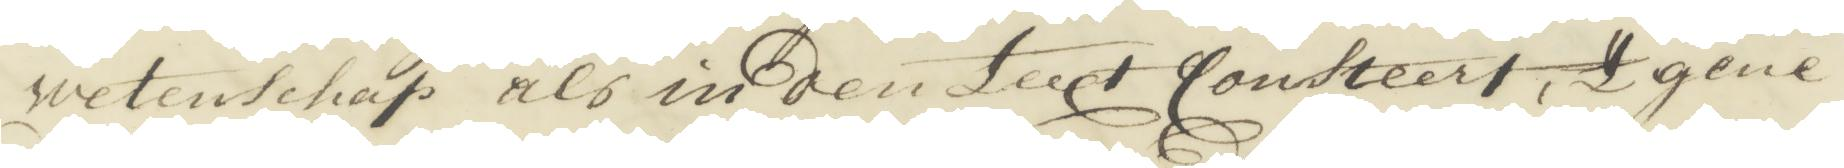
wetenschap als in den text Consteert, 't gene
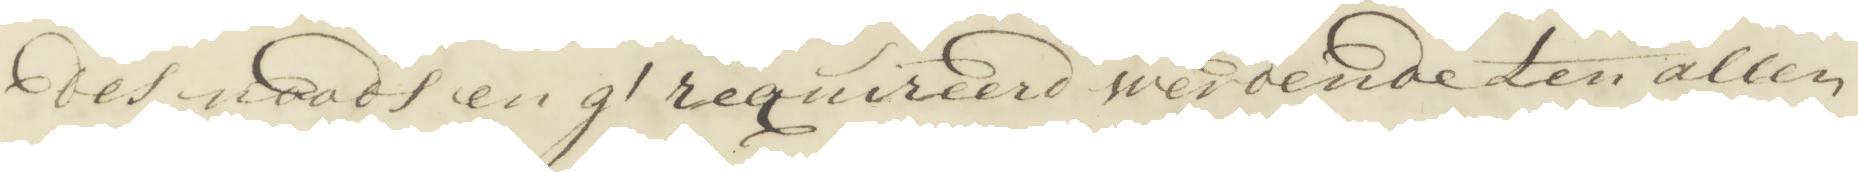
des noods en g’requireerd werdende ten allen
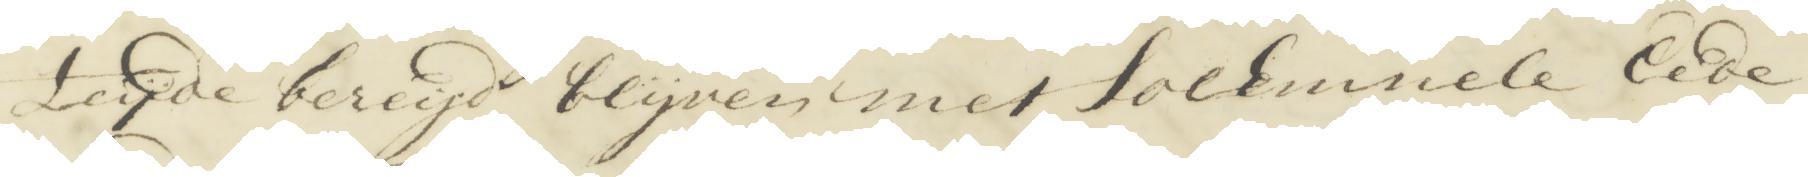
teijde bereijd blijven met solEmnele Eede
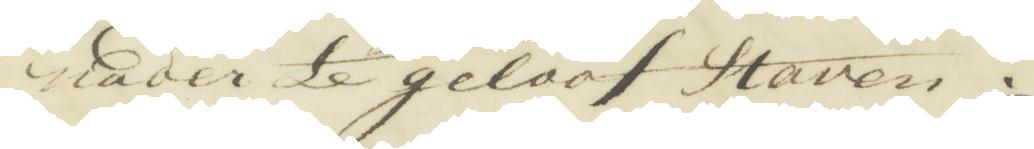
nader te geloof staven.
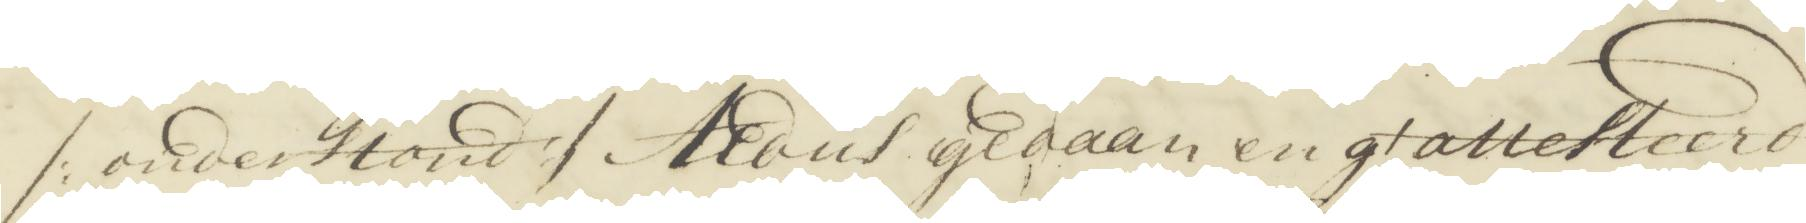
/:onderstond:/ Aldus gedaan en g'attesteerd
